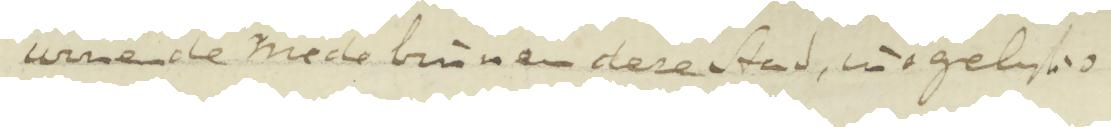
wonende mede binnen deze stad, insgelyks
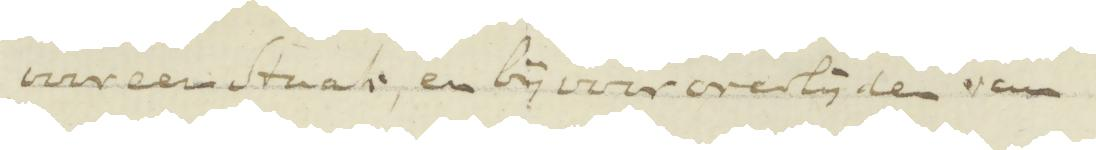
voor een staak, en bij voor overlijden van
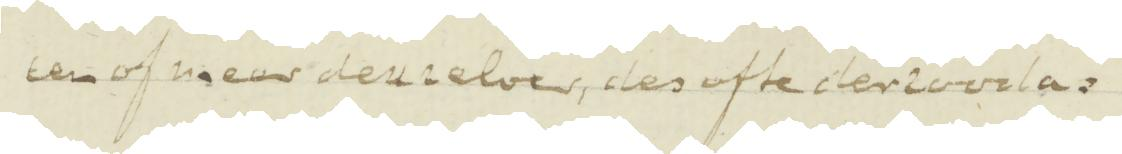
een of meer denzelver, des ofte der zooda=
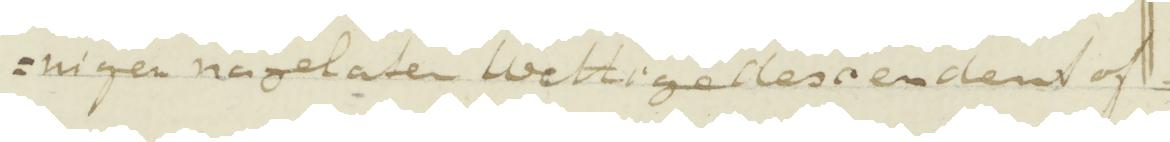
=nigen nagelaten wettige descendent of
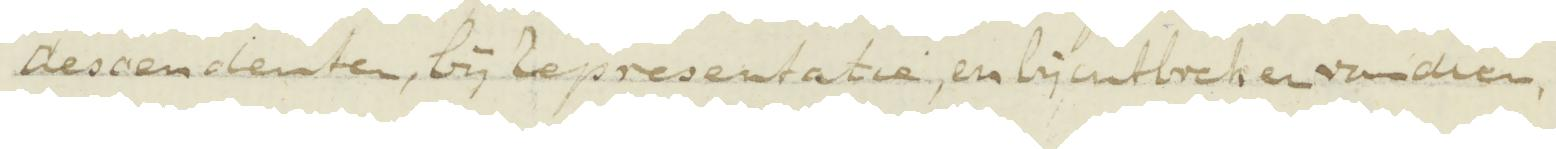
descendenten, bij Representatie, en bij ontbreken vandien,
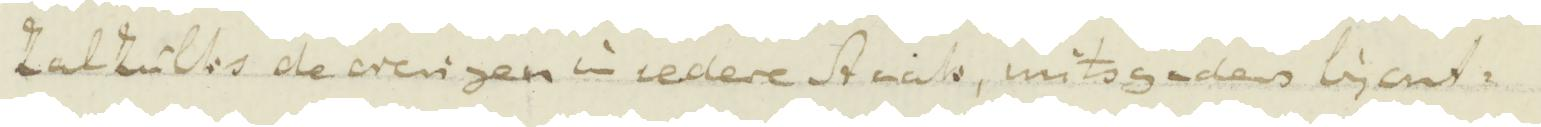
Zal zulks de overigen in iedere staak, mitsgaders bij ont=
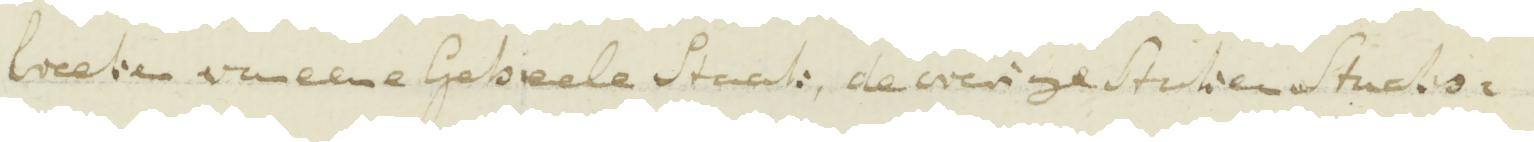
breeken van eene Geheele staak:, de overige staken stucks=
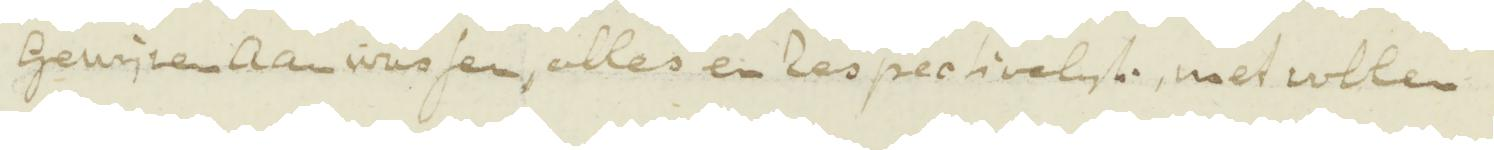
Gewijzen aan wassen, alles en respectivelijk, met vollen
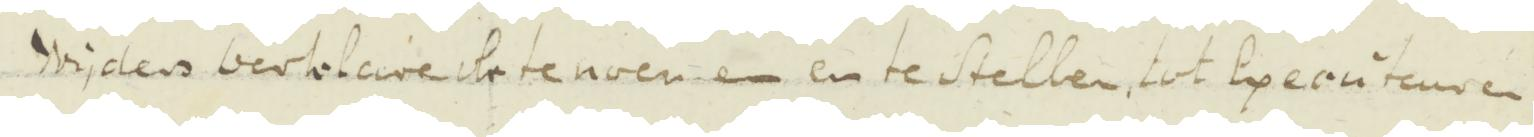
wijders verklare ik te noemen en te stellen, tot Executeuren
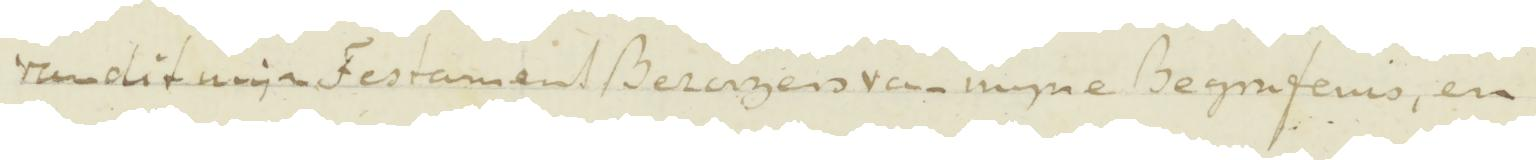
van dit mijn Testament Bezorgers van Begrafenis, en
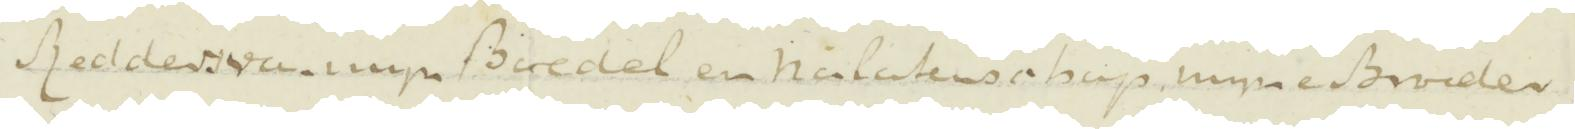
Redders van myn Boedel en Nalatenschap, mijne Broeder
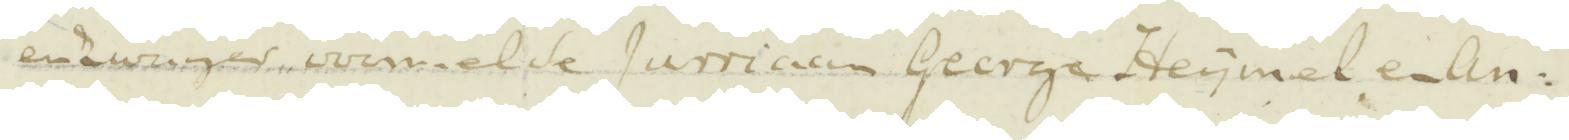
en zwager„ voormelde Jurriaan George Heijmel en An:
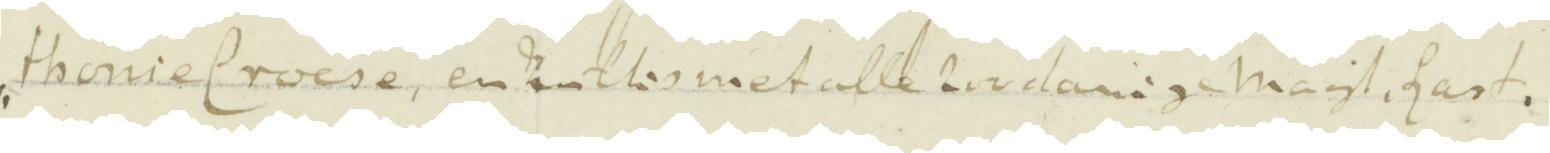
thonie Croese, en Zulks met alle zoodanige Magt, Last,
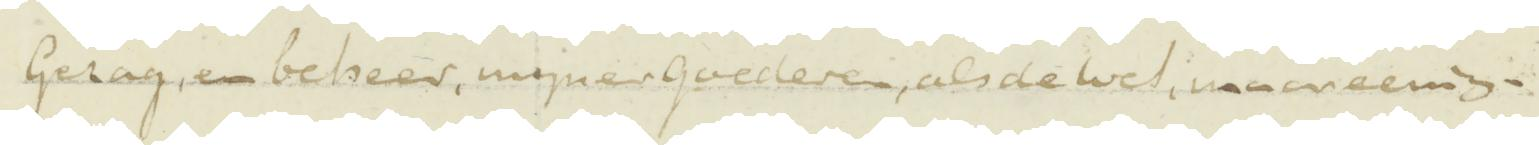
Gezag, en beheer, mijner goederen, als de wet, maar eenig-
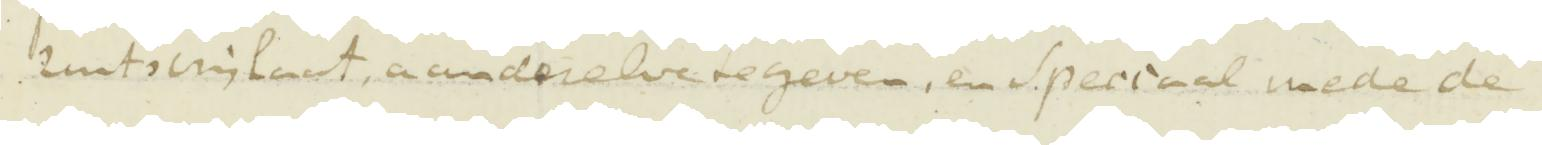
sints vrijlaat, aan dezelve te geven, en speciaal mede de
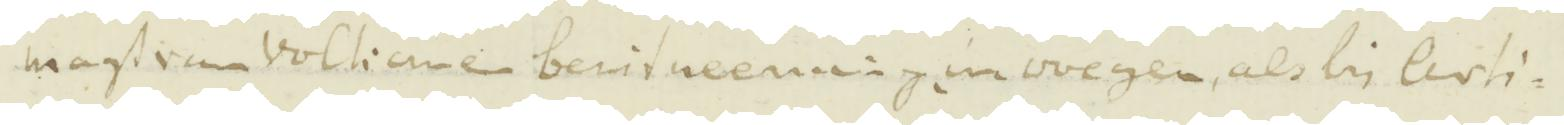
magt van volkomen bezitneeming, in voegen, als bij Arti=
